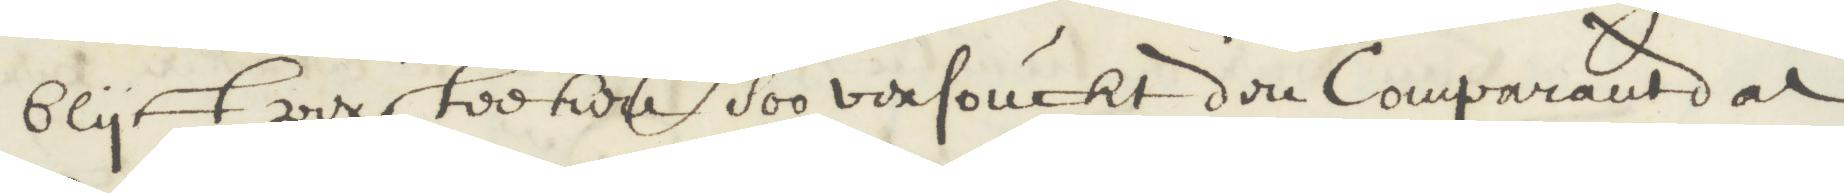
blijft versteeken soo versouckt den Comparant dat
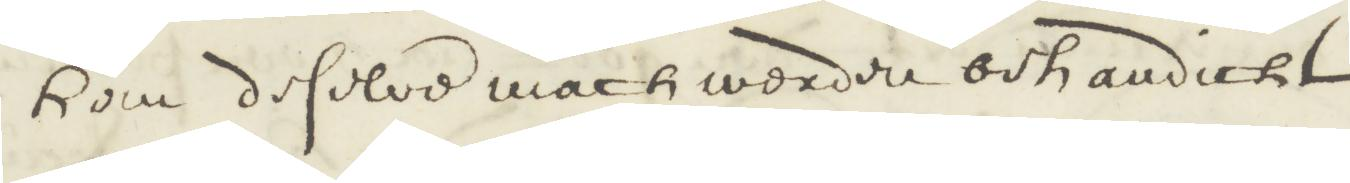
hem deselve mach werden behandicht
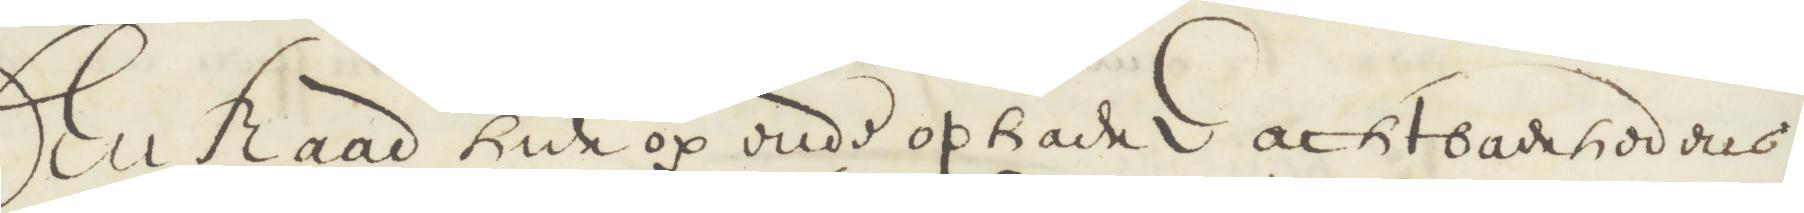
Den Raad hier op ende op haer E achtbaerhedens —
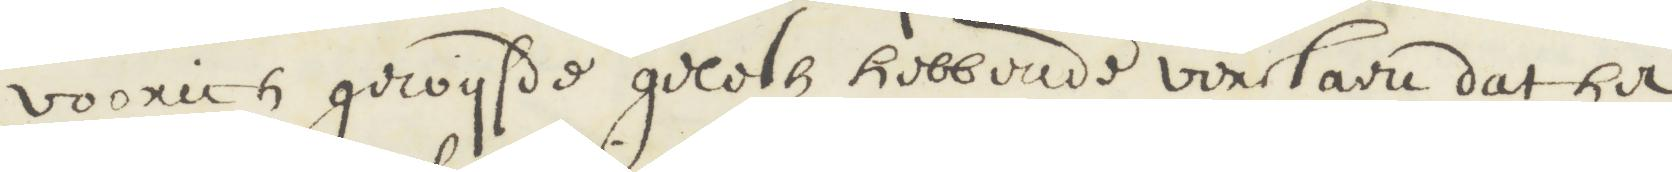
voorich gewijsde geleth hebbende verstaen dat het
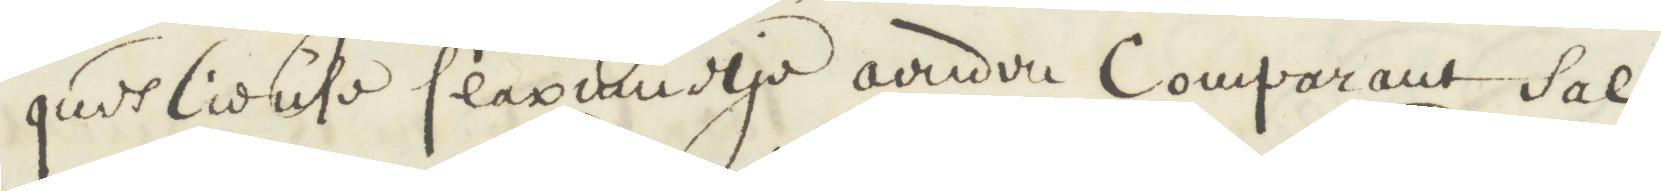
questieuse slavinnetje aenden Comparant sal
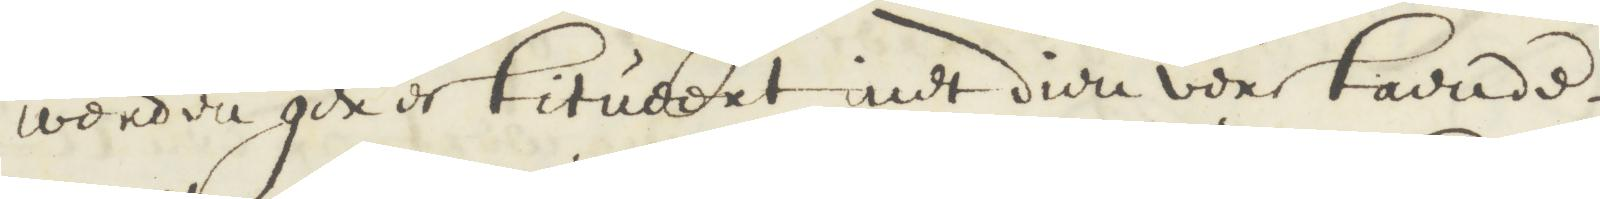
werden gerestitueert met dien verstaende —
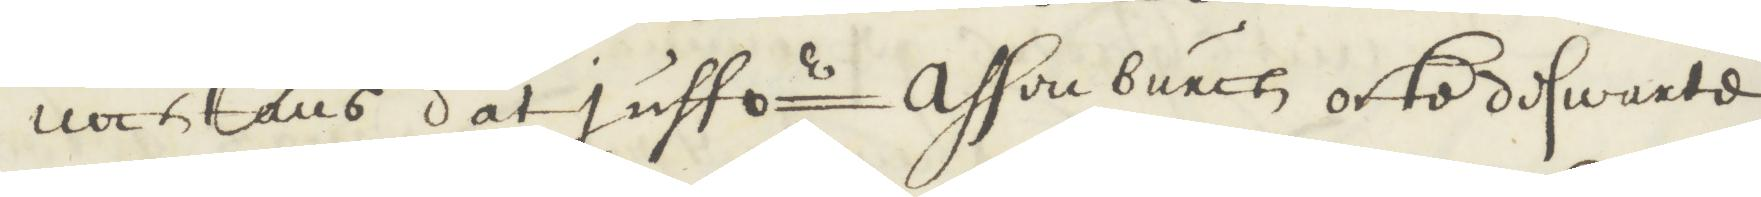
nochtans dat juffv=r assen burch ofte deswarte
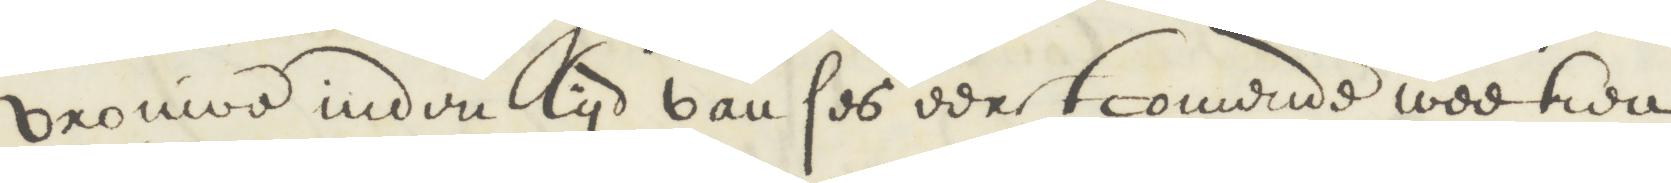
vrouwe inden tijd van ses eerstcomende weeken
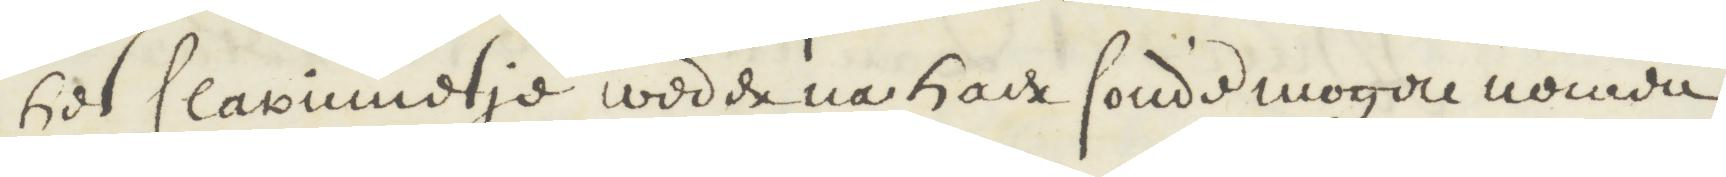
het slavinnetje weder na haer soude mogen nemen
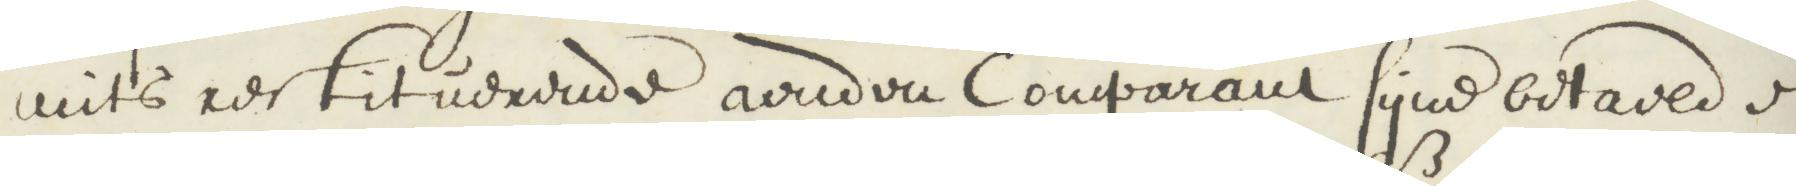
mits restituerende aenden Comparant sijne betaeld e
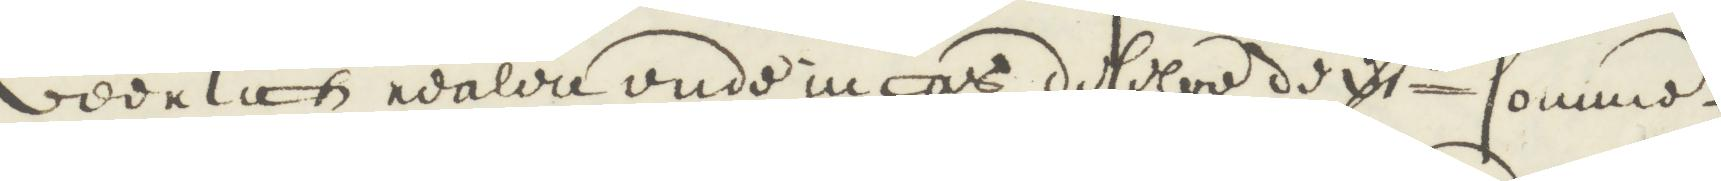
veertich realen ende in cas deselve de voors= somme —
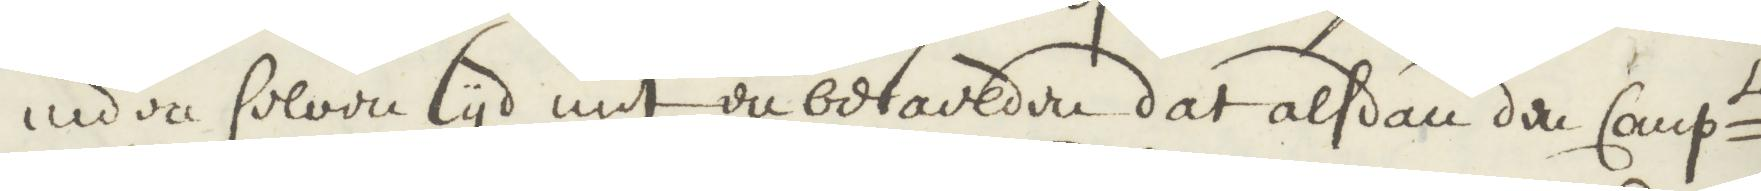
inden selven tijd niet en betaelden dat alsdan den Comp=t
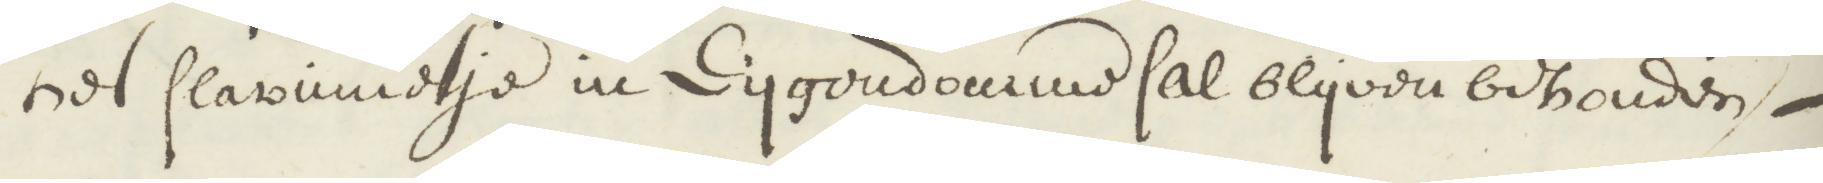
het slavinnetje in Eijgendomme sal blijven behouden —
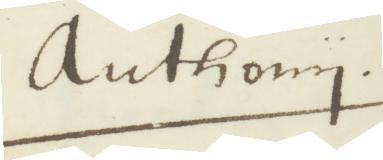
Anthonij.
